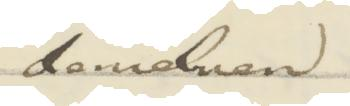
dencelven
